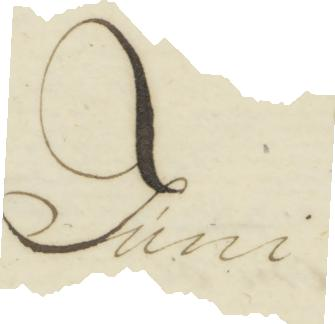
Iuni
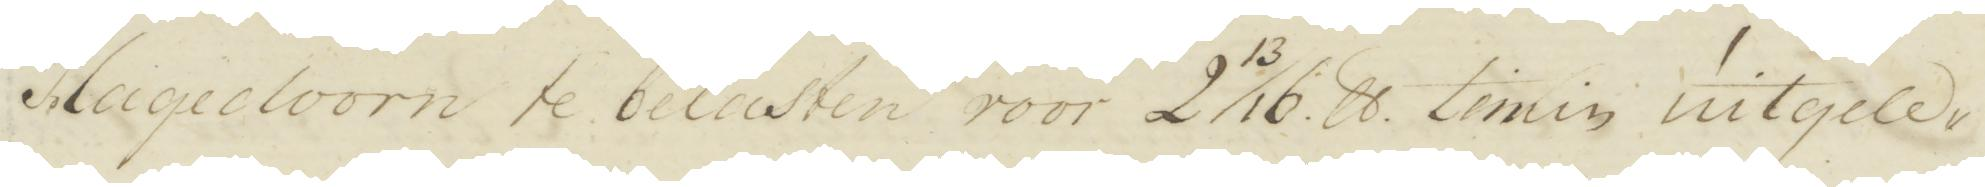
Hagedoorn te belasten voor 2 13/16. lb. te min uitgele
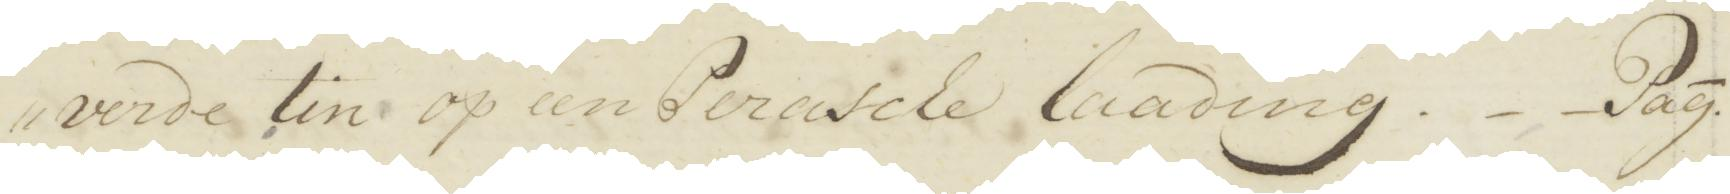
„verde tin op een Perasche laading. - - Pag.
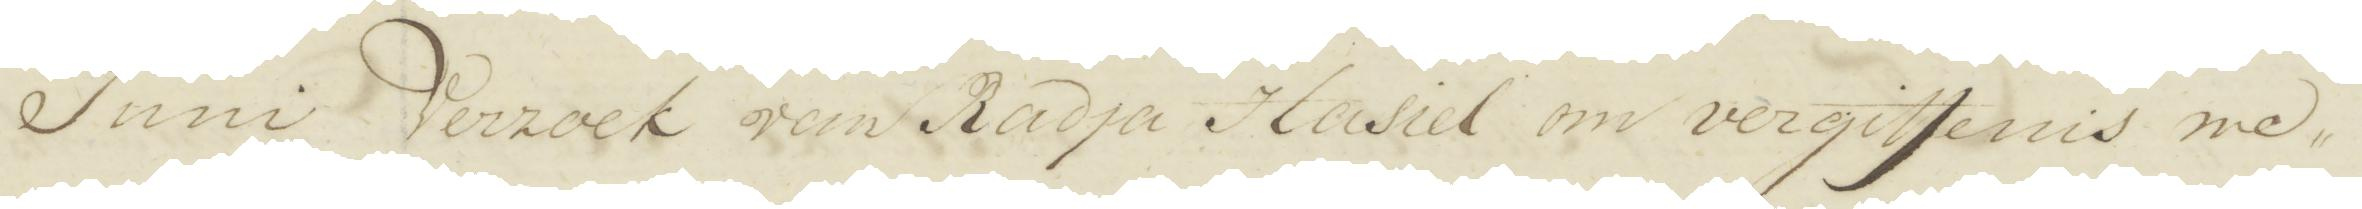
Iuni Verzoek van Radja Hasiel om vergiffenis we„
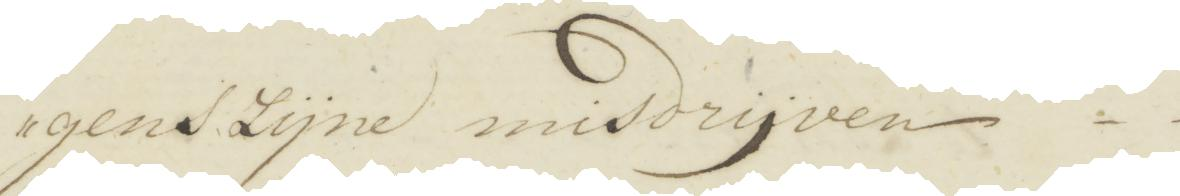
„gens Zijne misdrijven -
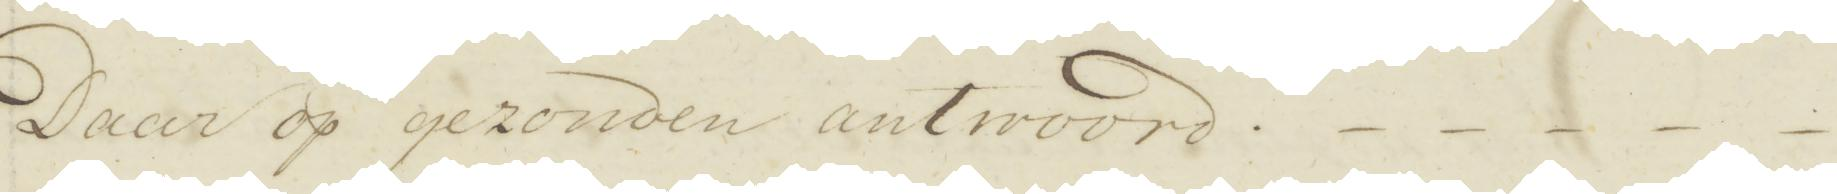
Daar op gezonden antwoord . - - - - -
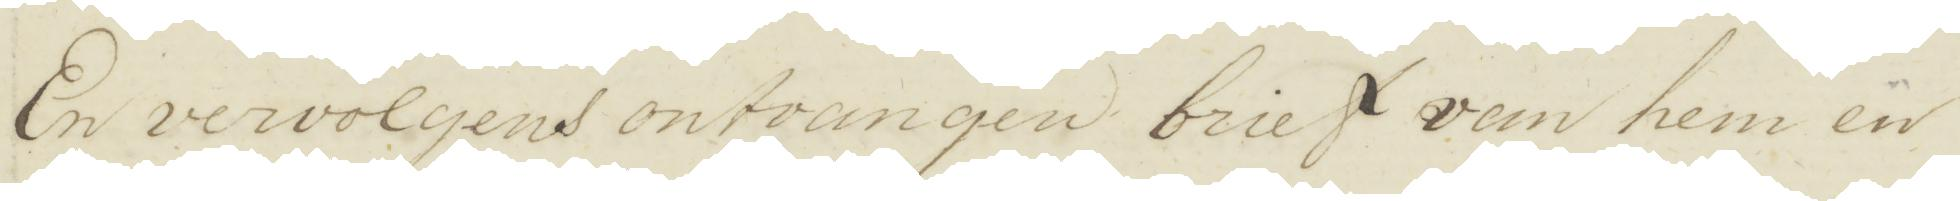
En vervolgens ontvangen brief van hem en
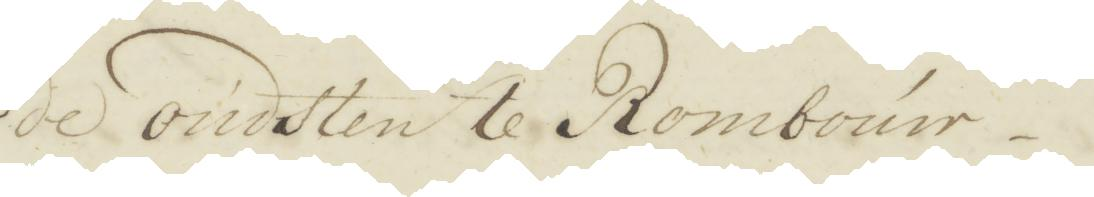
de oudsten te Rombouw -
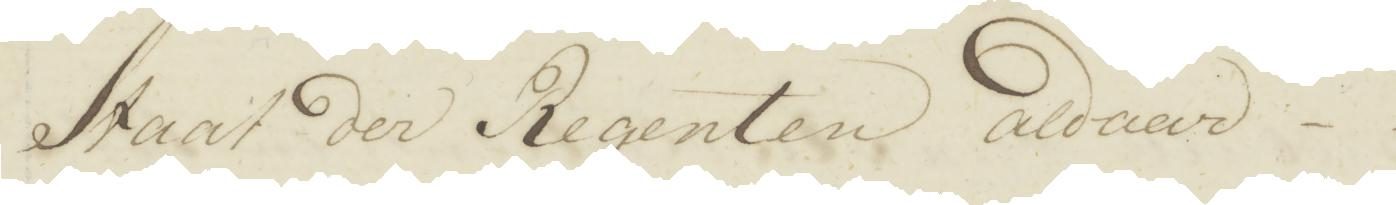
Staat der Regenten aldaar -
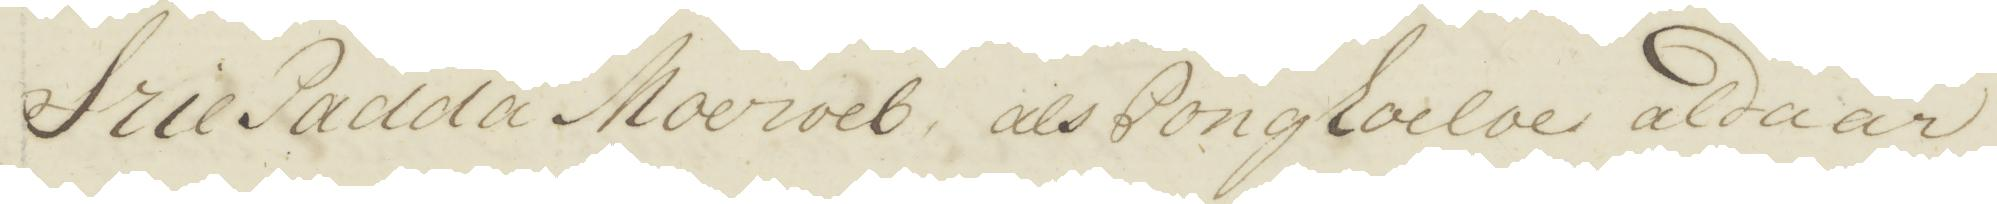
Srie Padda Moeroeb, als Ponghoeloe aldaar
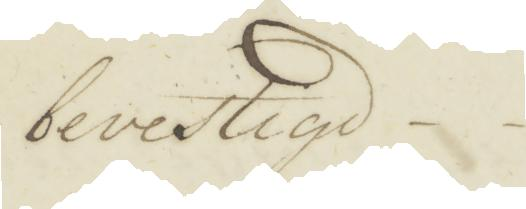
bevestigd -
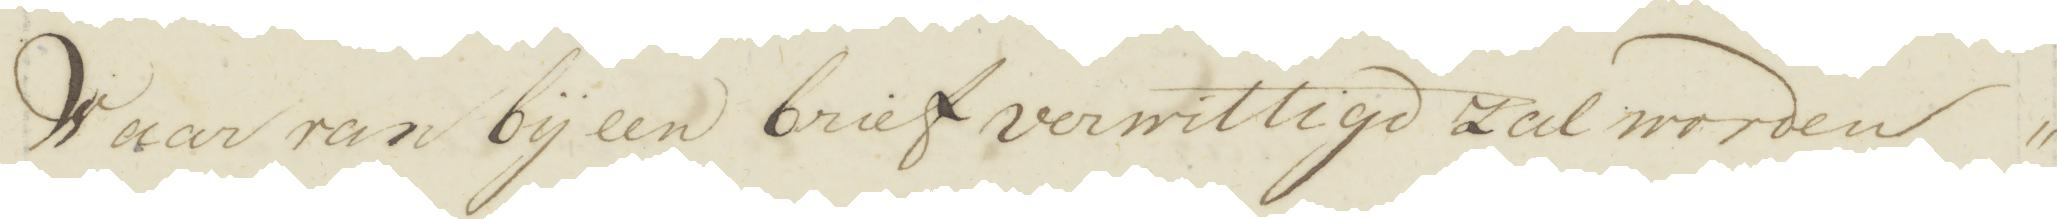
Waar van bij een brief verwittigd zal worden„
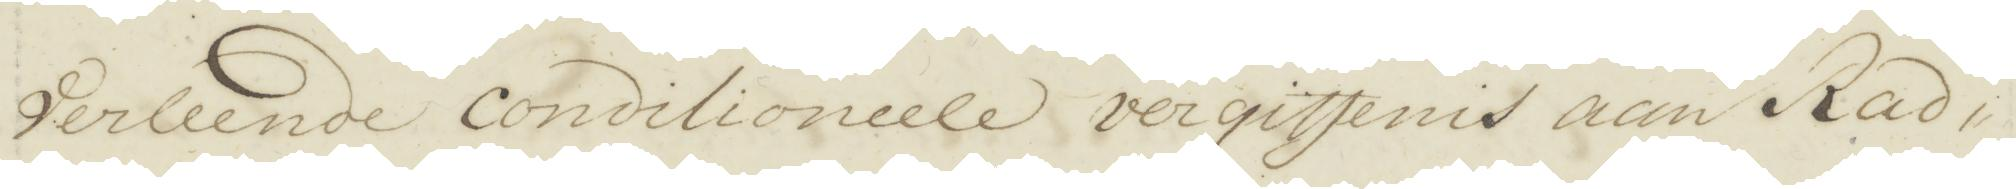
verleende conditioneele vergiffenis aan Rad„
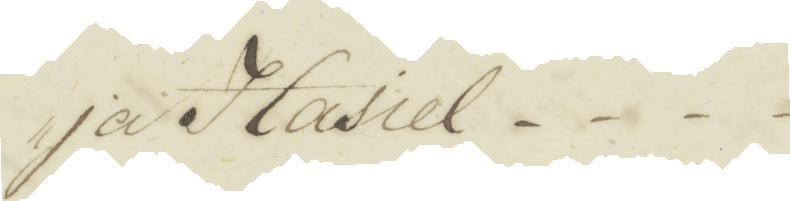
„ja Hasiel - - -
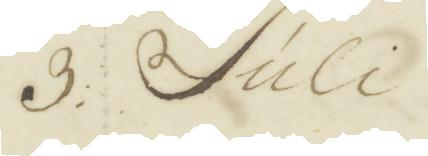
3: Iuli
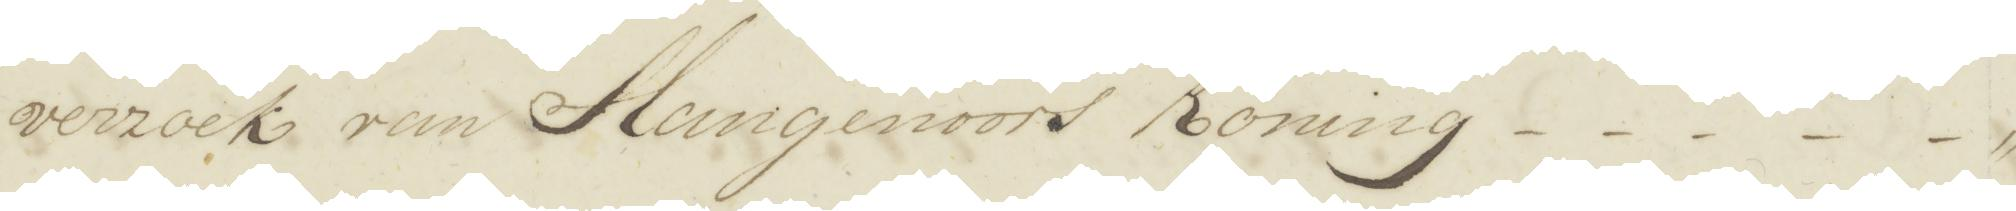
verzoek van Slangenoors Koning - - - - - „
